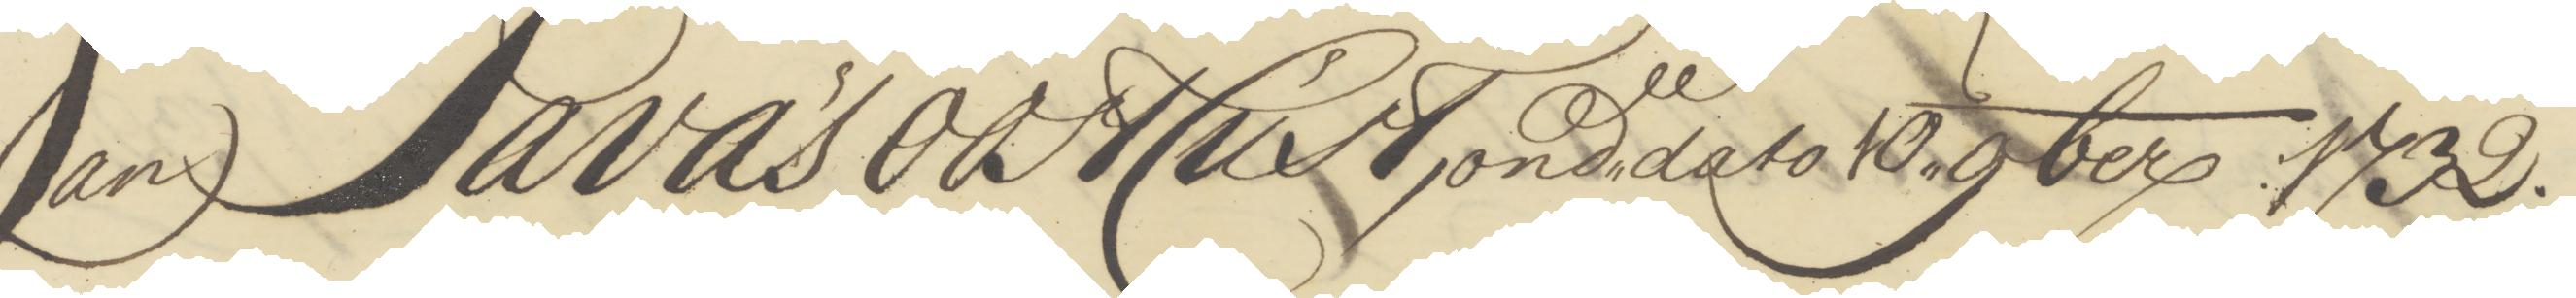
Van Iava's oostCust, ond„dato 10„' 9ber: 1732.
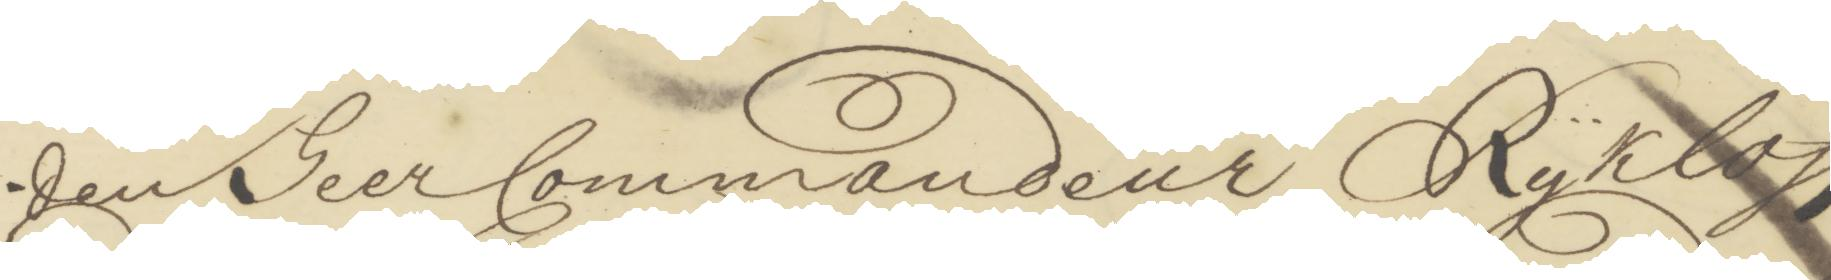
den heer Commandeur Rijkloff
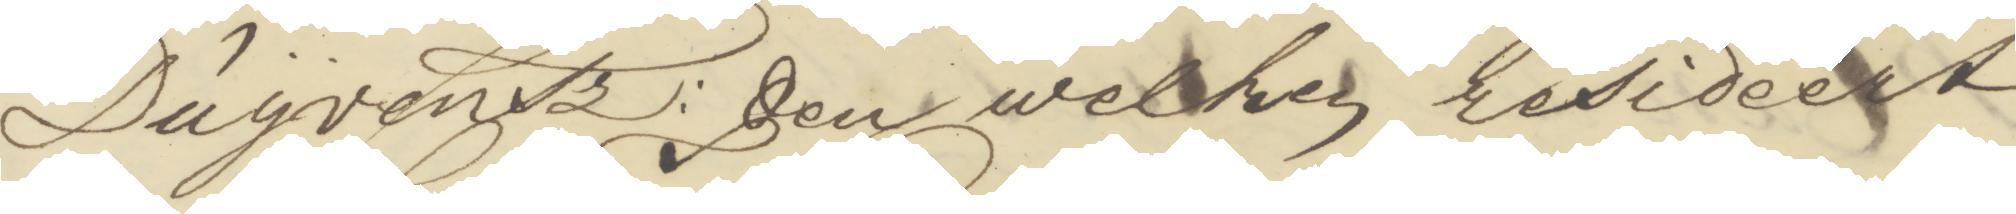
Duijvensz: den welken resideert
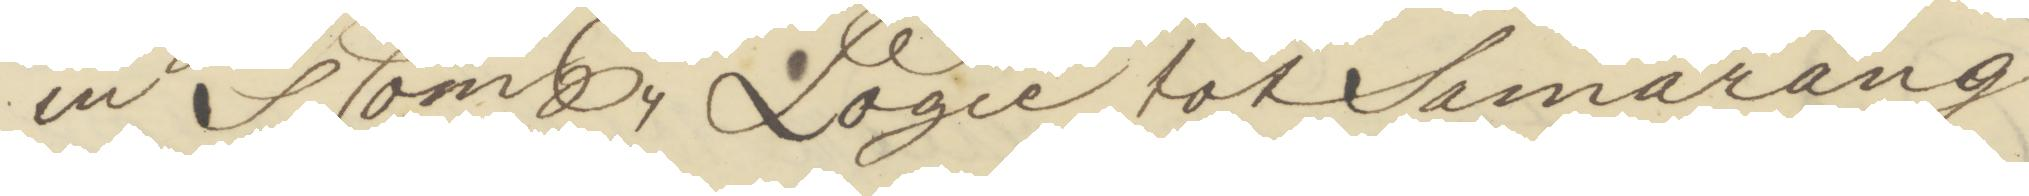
in 's Comp„s Logie tot samarang
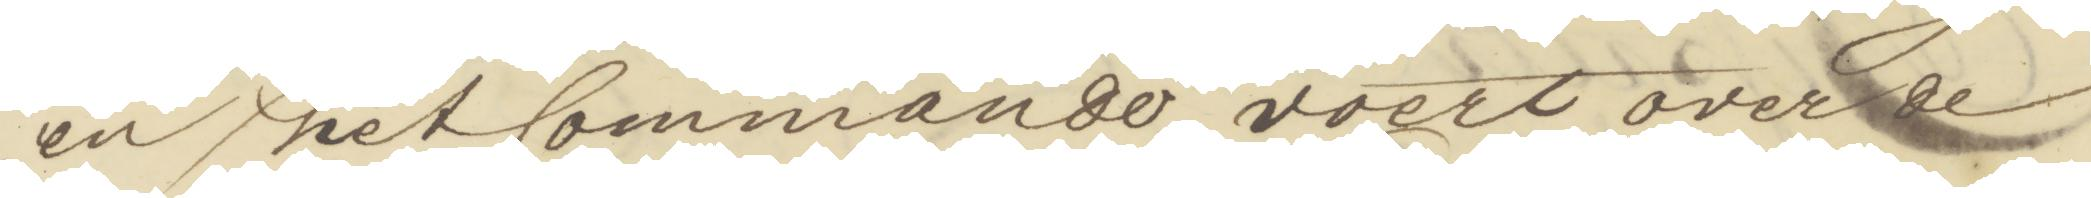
en het Commando voert over de
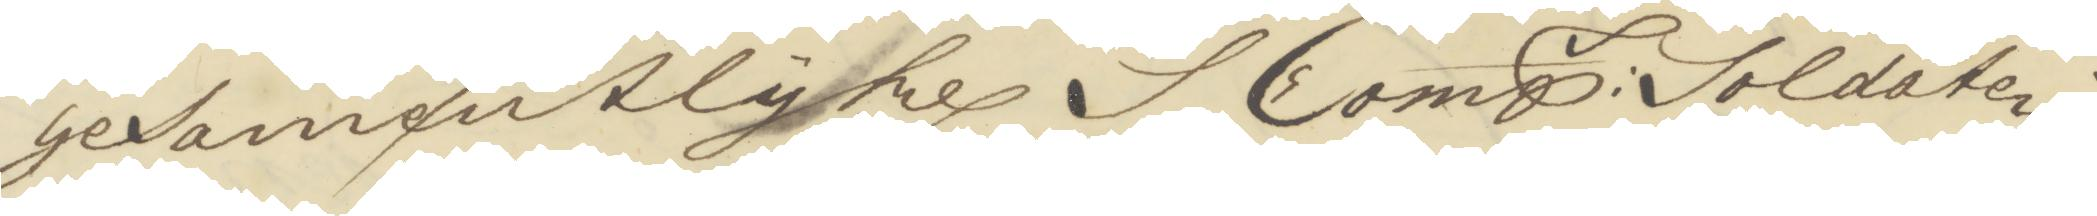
gesamentlijke 's Comp:s soldaten;
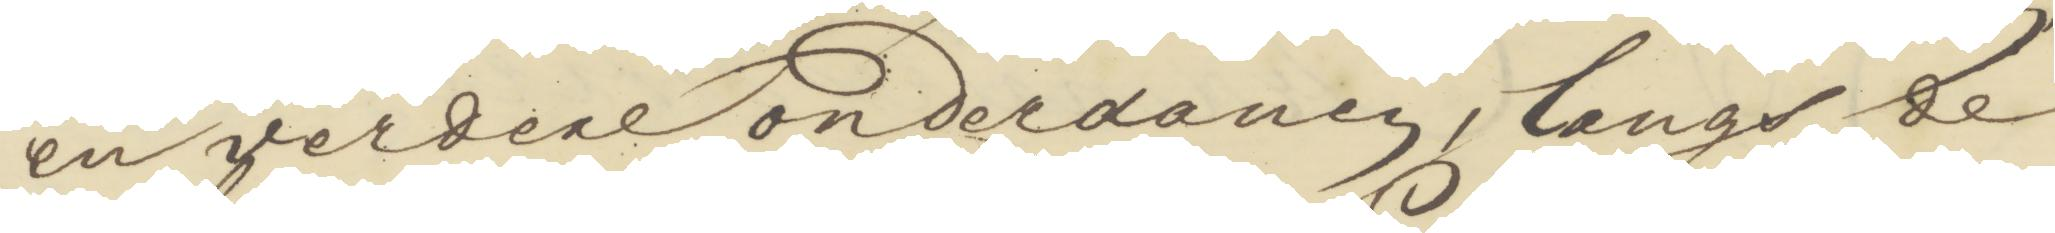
en verdere onderdanen, langs de
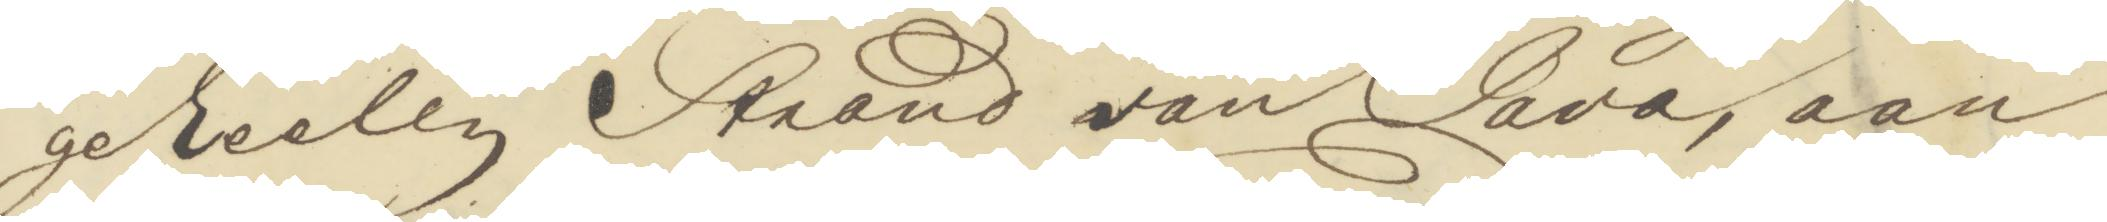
geheelen strand van Iava, aan
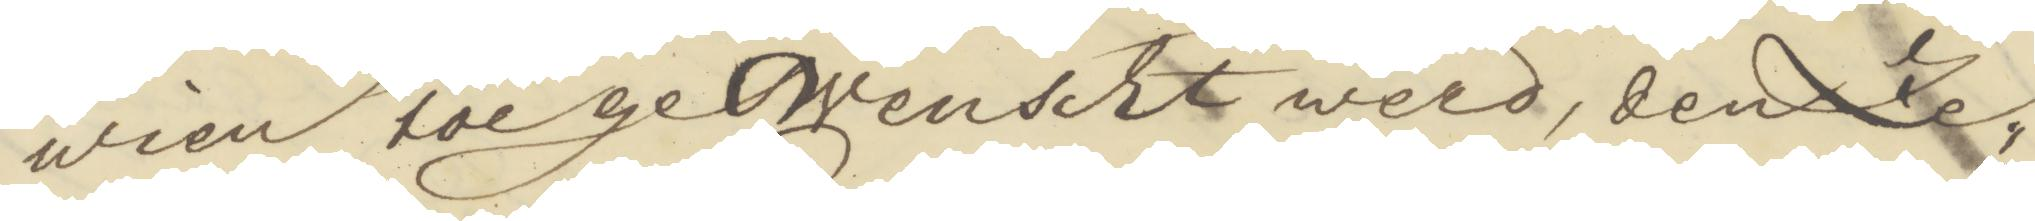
wien toegewenscht werd, den Ze„
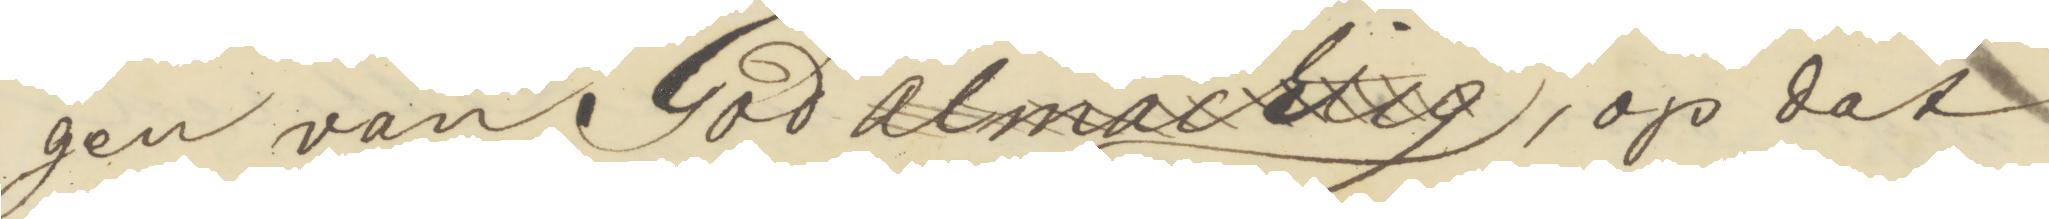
gen van God almachtig, op dat
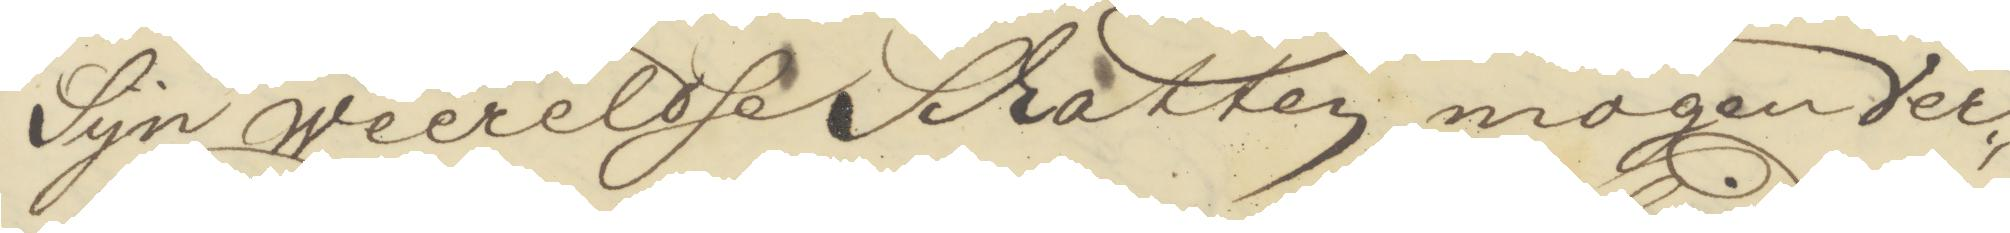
sijn weereldse schatten mogen Ver„
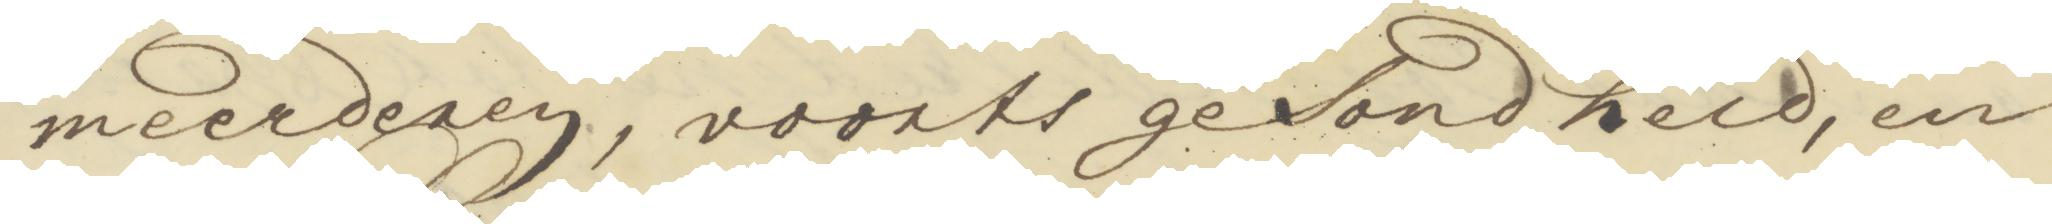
meerderen, voorts gesondheid, en
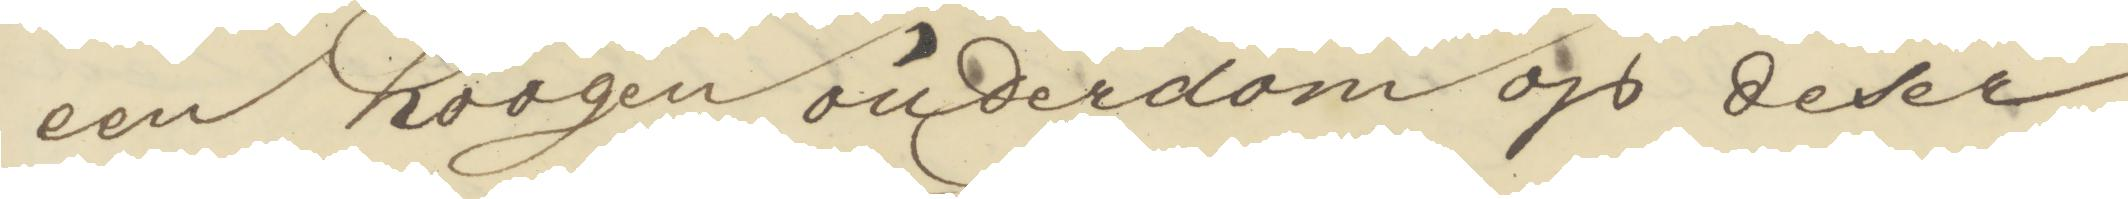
een hoogen ouderdom op deser
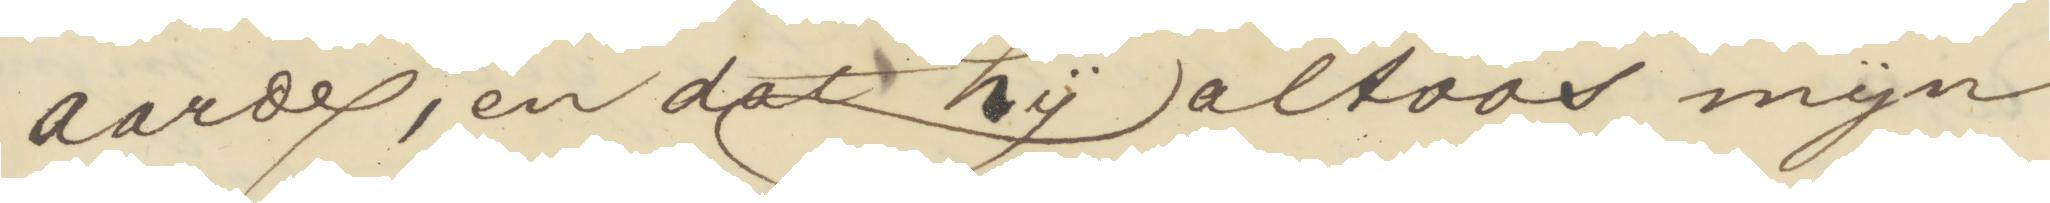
aarde, en dat hij altoos mijn
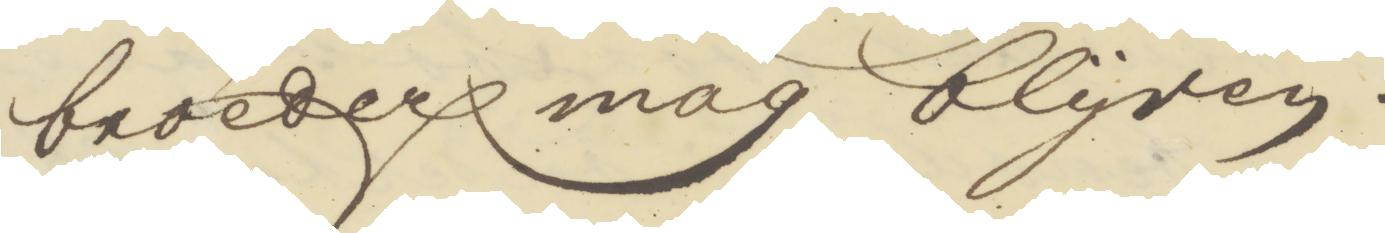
broeder mag blijven.
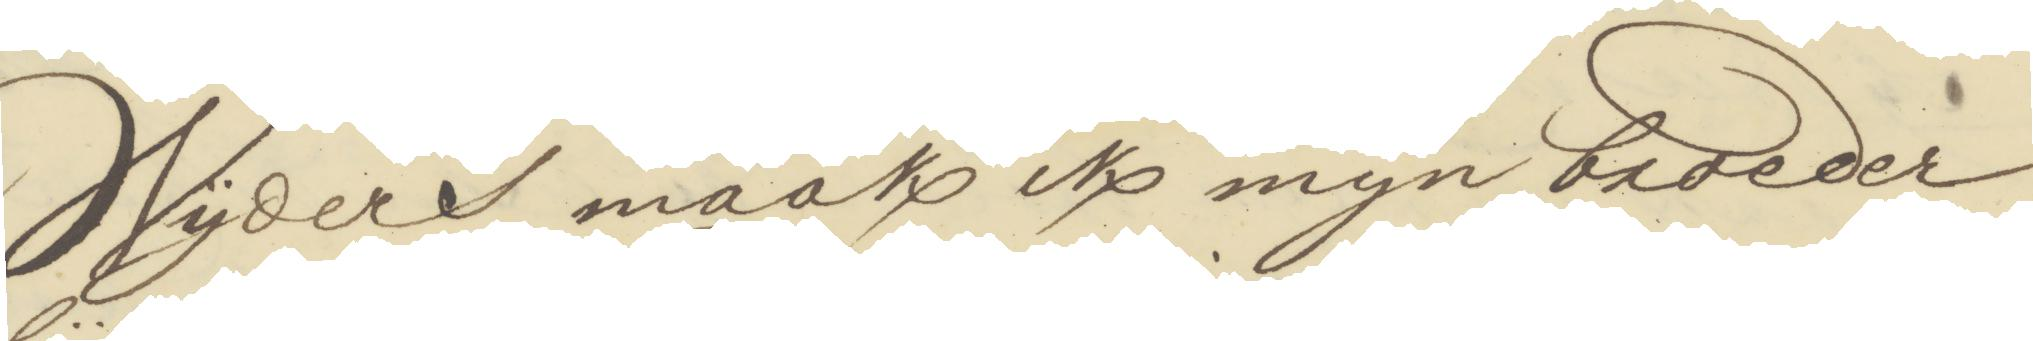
Wijders maak ik mijn broeder
